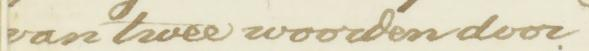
van twee woorden door
